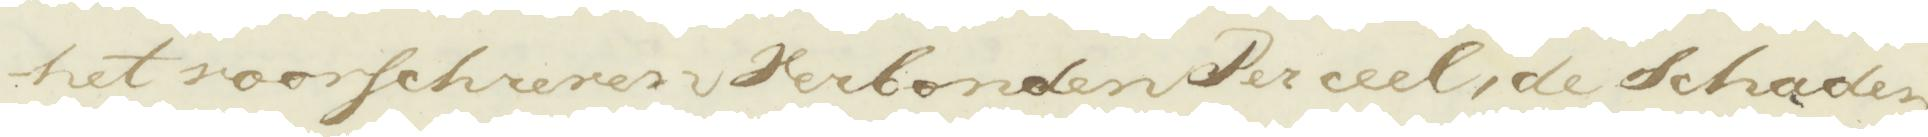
het voorschreven verbonden Perceel, de schaden
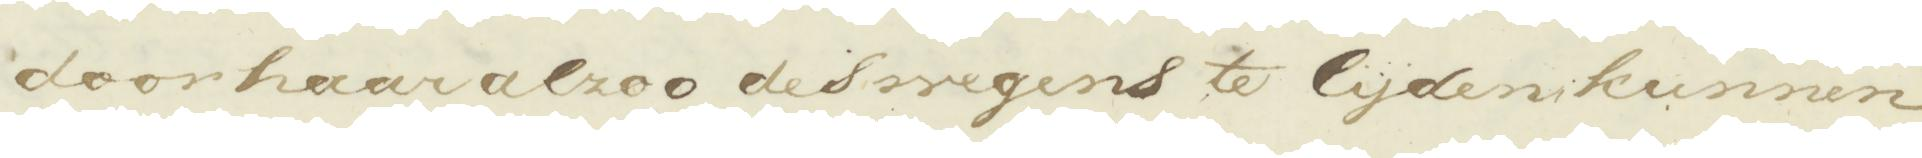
door haar alzoo deswegens te lijden kunnen
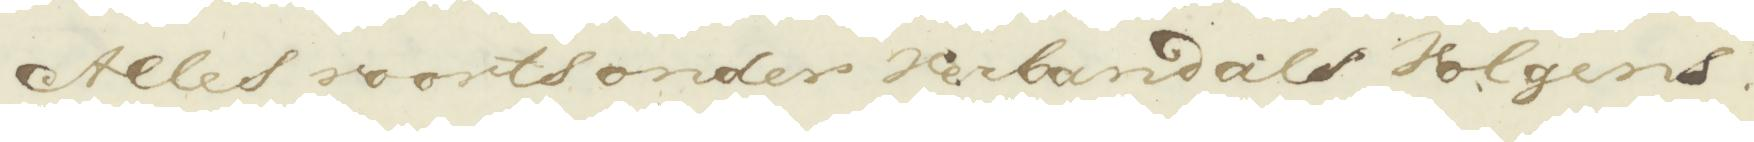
Alles voorts onder verband als volgens
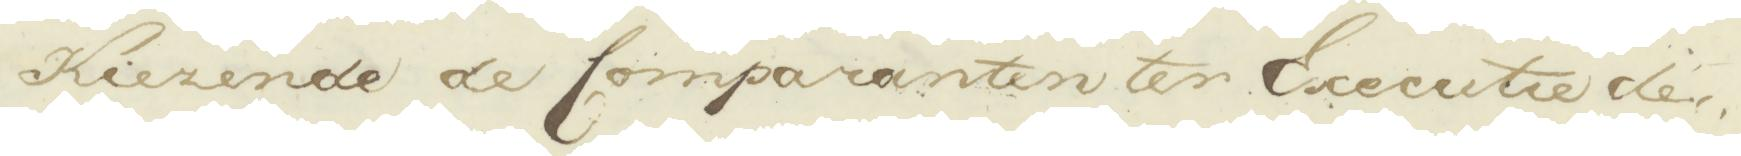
Kiezende de Comparanten ter Executie de„
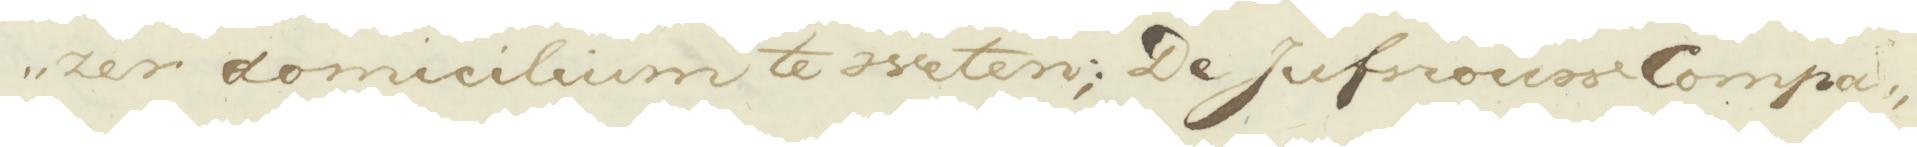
„zer domicilium te weten,: De Jufvrouw Compa„
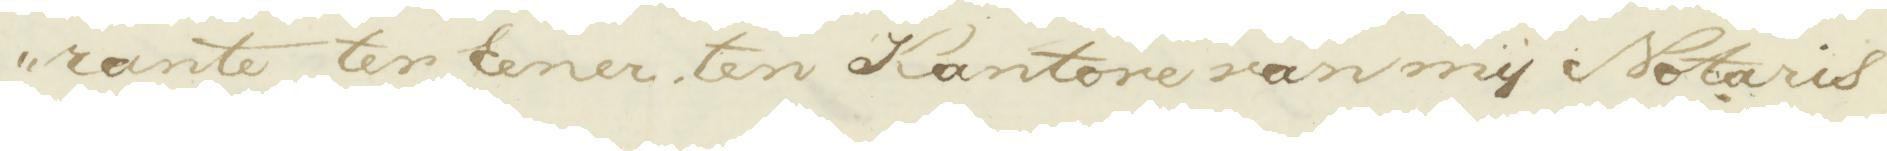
„rante ter Eener, ten Kantore van mij Notaris
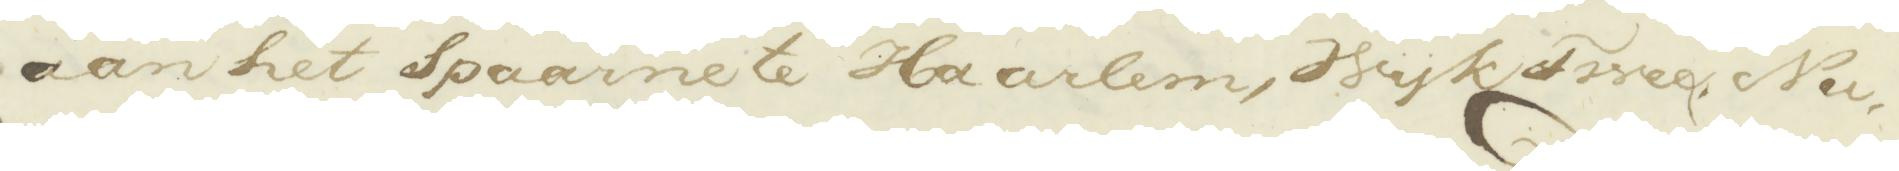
aan het Spaarne te Haarlem, Wijk Twee, Nu,
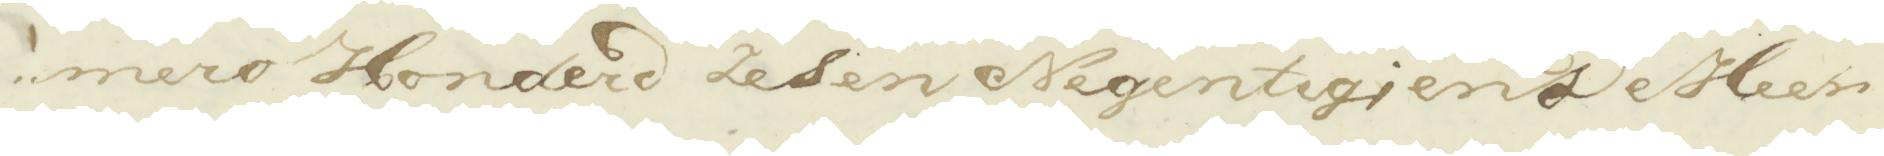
„mero Honderd zes en Negentig; en De Heer
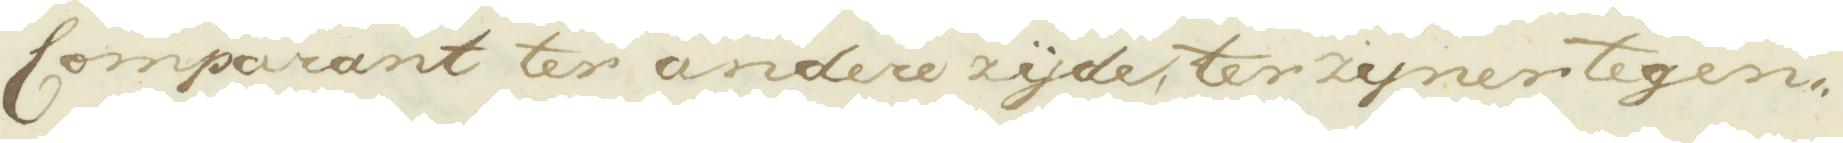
Comparant ter andere zijde, ter zijner tegen„
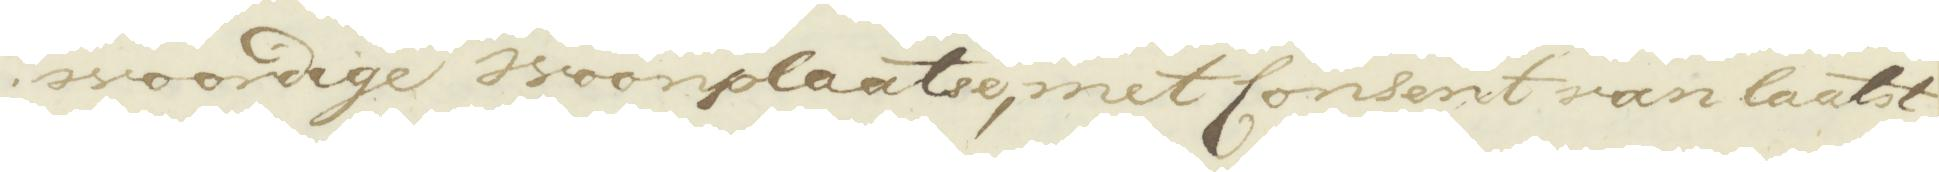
,woordige woonplaatse, met Consent van laatst
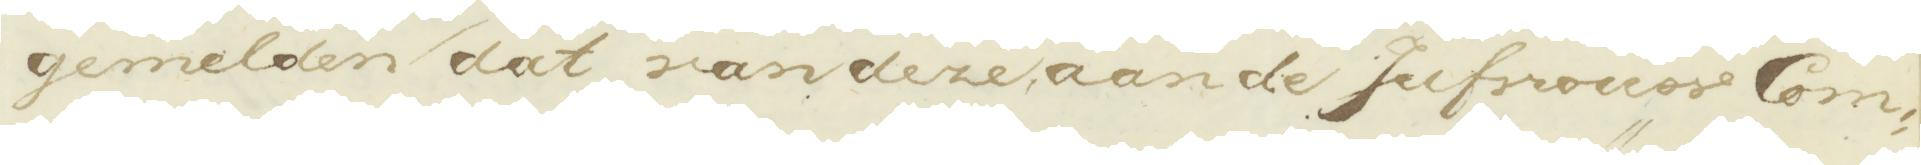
gemelden dat van deze, aan de Jufvrouw Com„
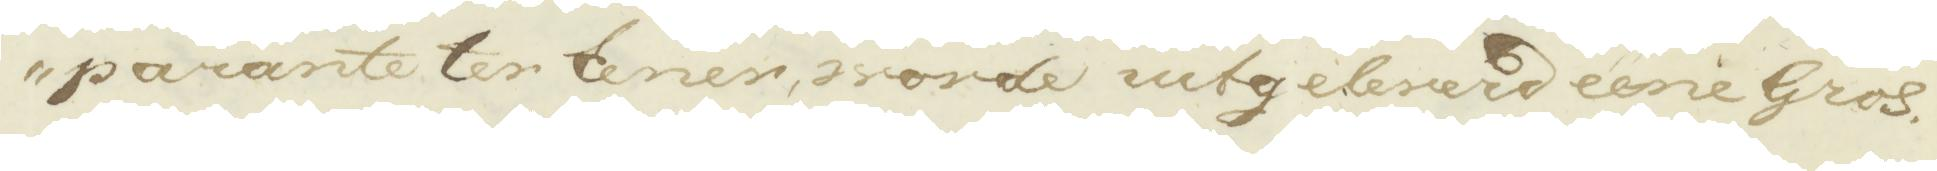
„parante ter Eener, worde uitgeleverd ééne Gros,
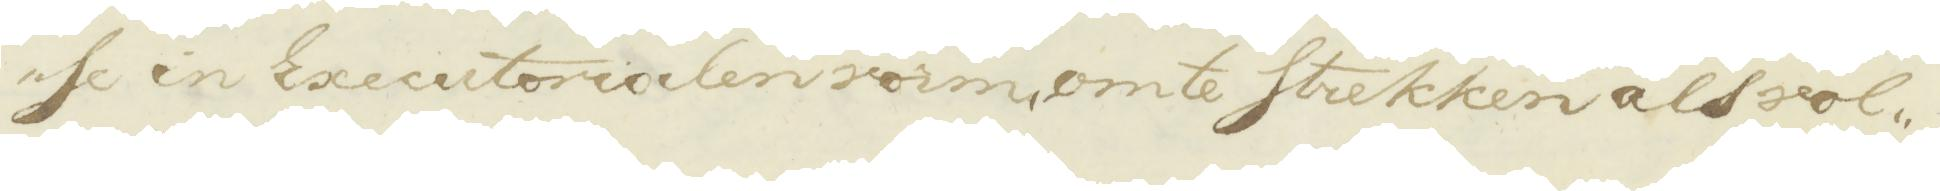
„se in Executorialen vorm, om te strekken als vol„
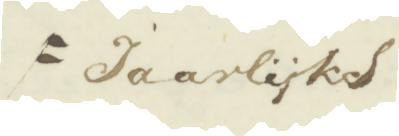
¶ Jaarlijks
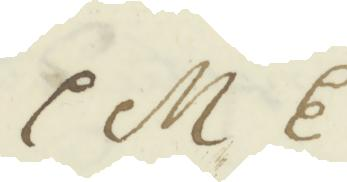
C M E
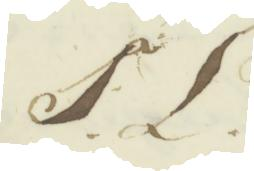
I. L.
